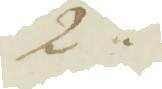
2 „ —
